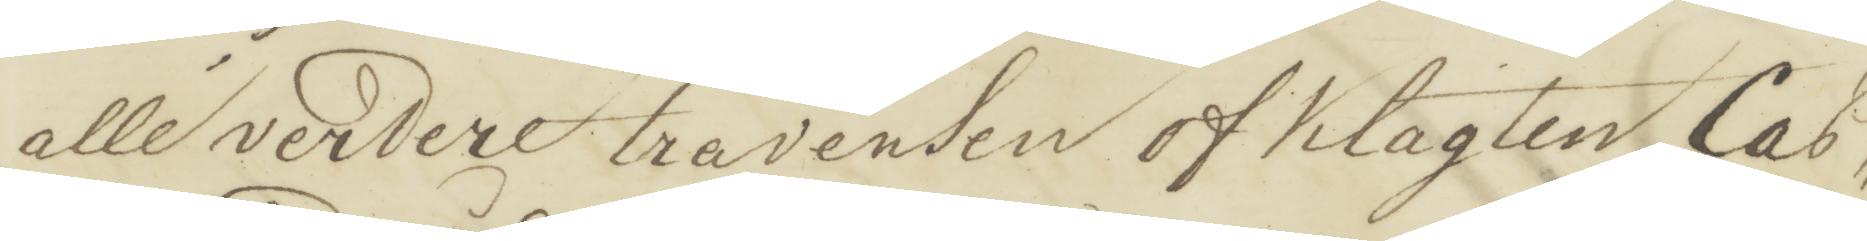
alle verdere traversen of klagten Cas
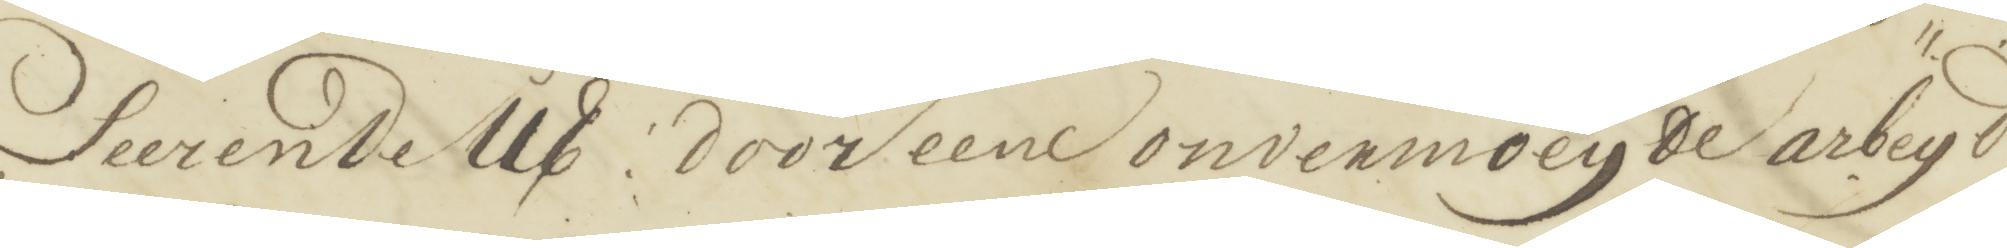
Seerende UE: door eene onvermoeijde arbeyd,
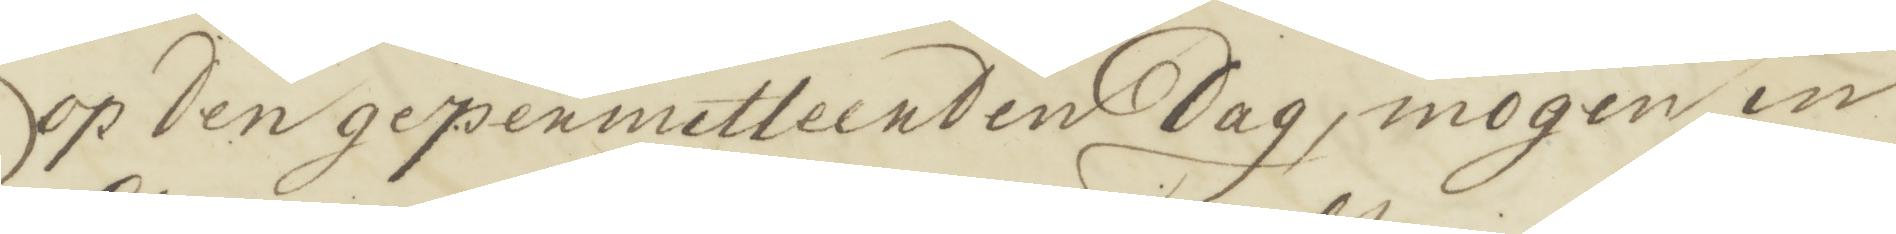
op den gepermitteerden Dag, mogen in
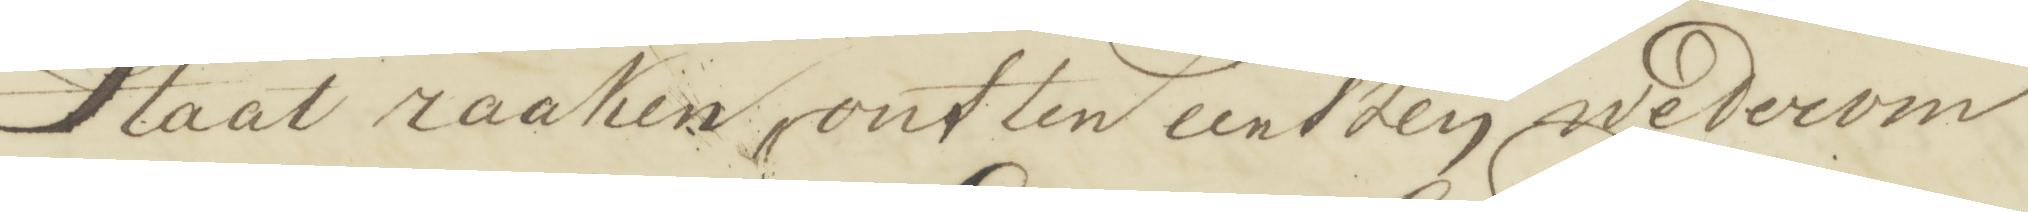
Staat raaken, ons ten eersten wederom
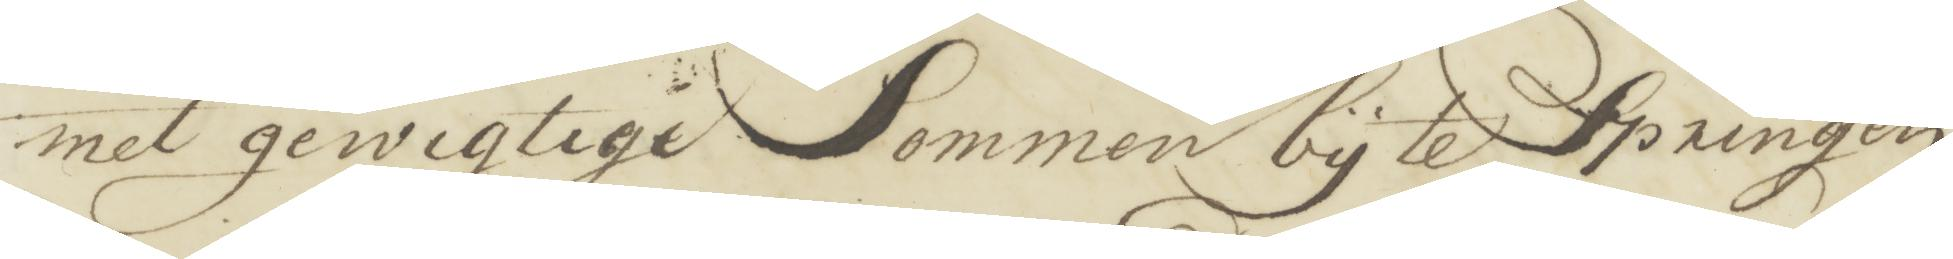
met gewigtige Sommen bij te Springen
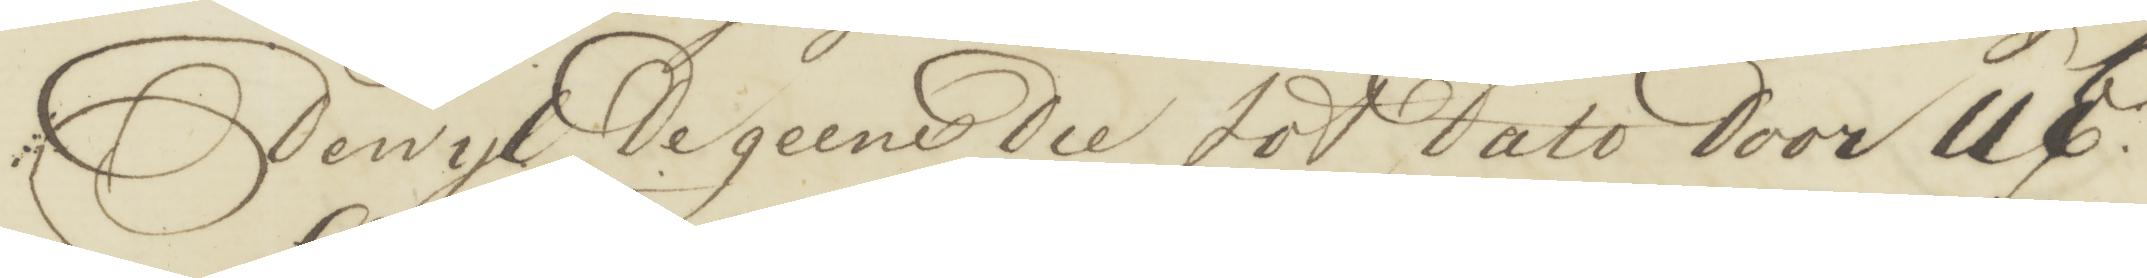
Dewijl de geene die tot dato door UE:
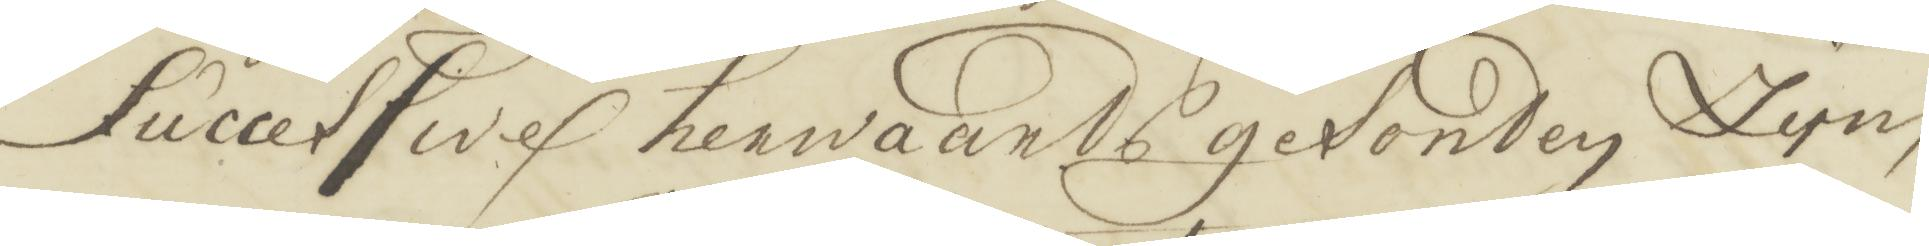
Successive herwaarts gesonden Zyn,
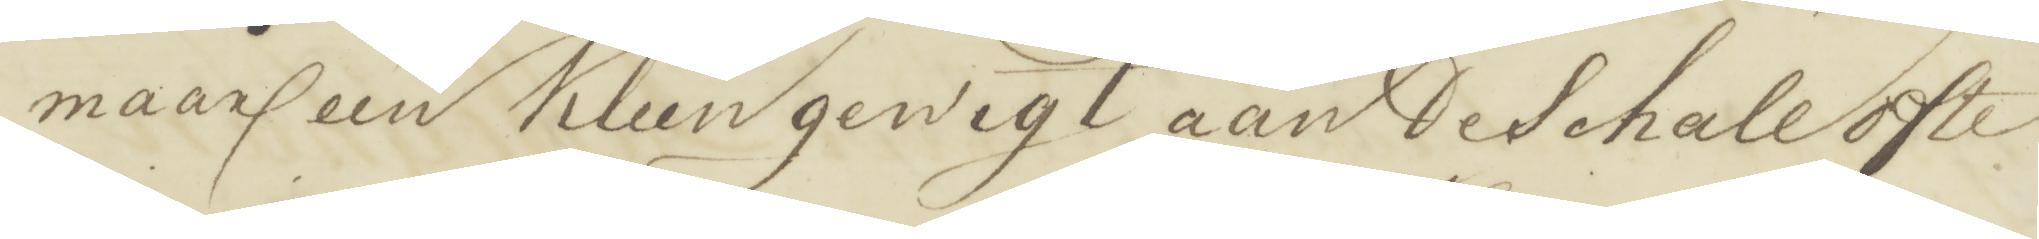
maar een kleen gewigt aan de Schale ofte
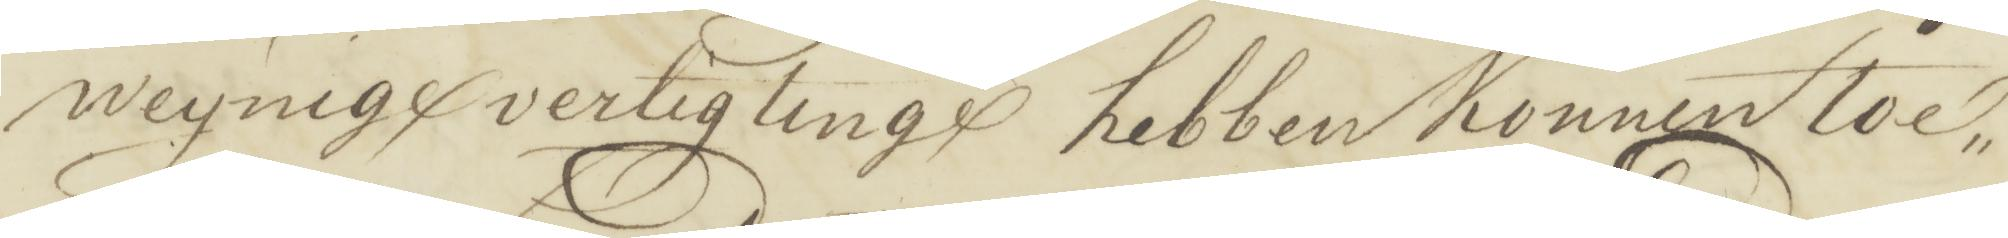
weijnige verligtinge hebben Konnen toe„
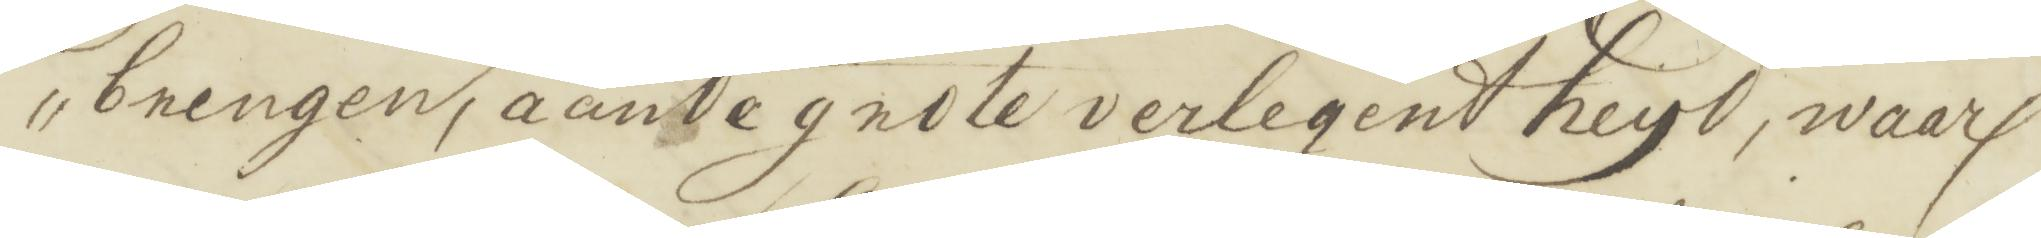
„brengen, aan de grote verlegentheijd, waar
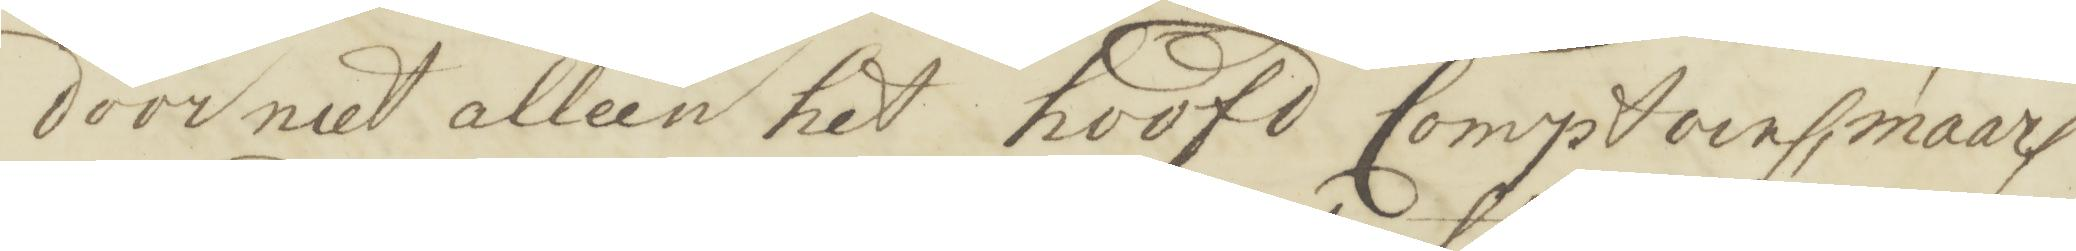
door niet alleen het hoofd Comptoir, maar
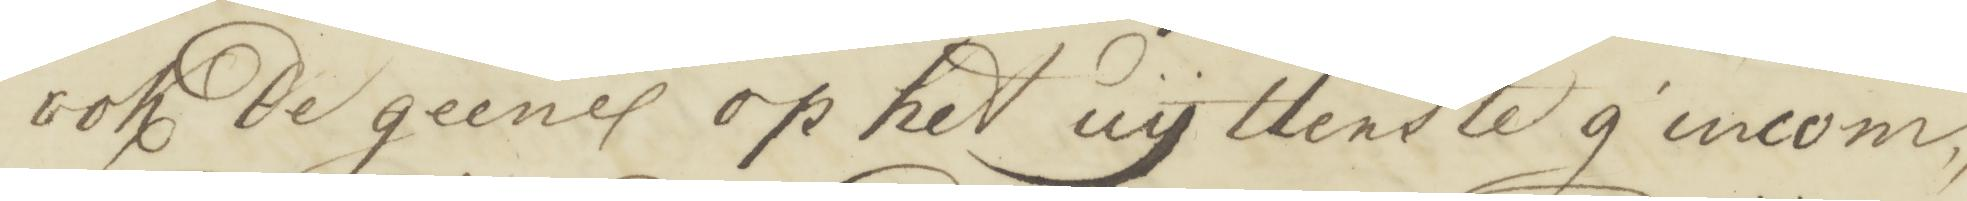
ook de geene op het uijtterste g’incom„
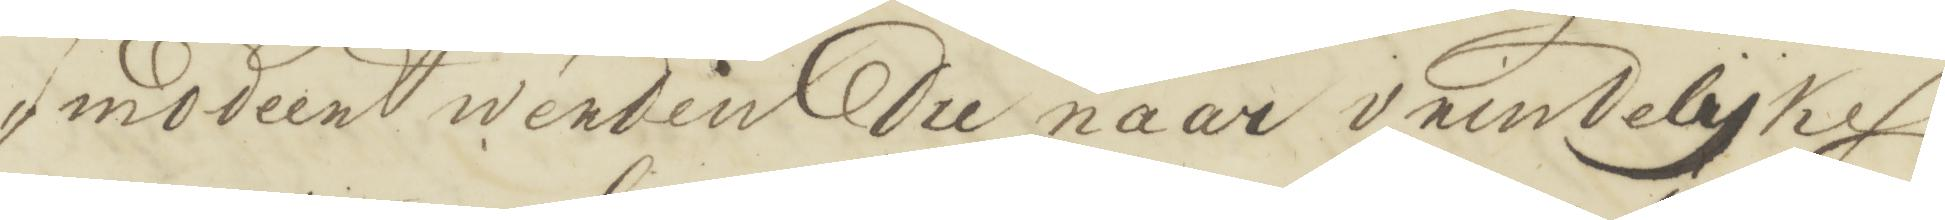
„modeert werden die naar vrindelijke
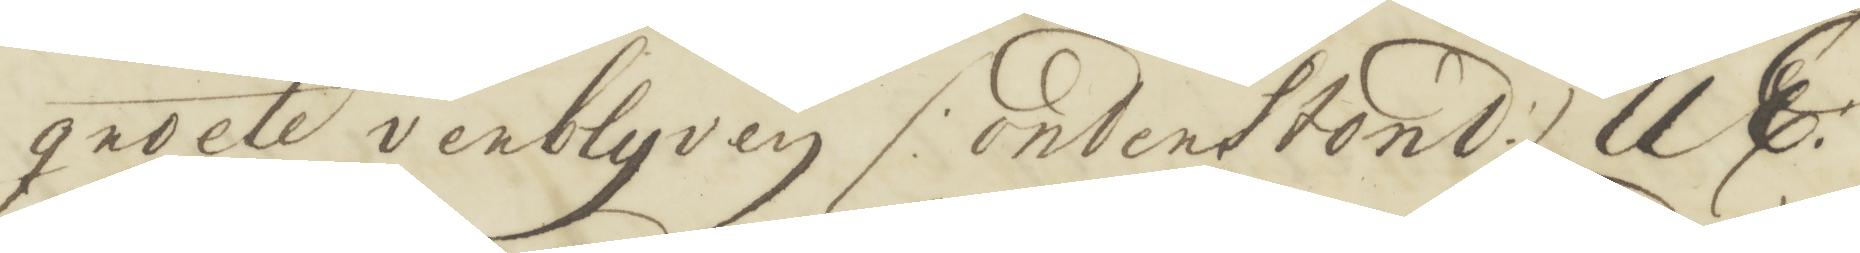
groete verblyven /:onderstond:/ UE:
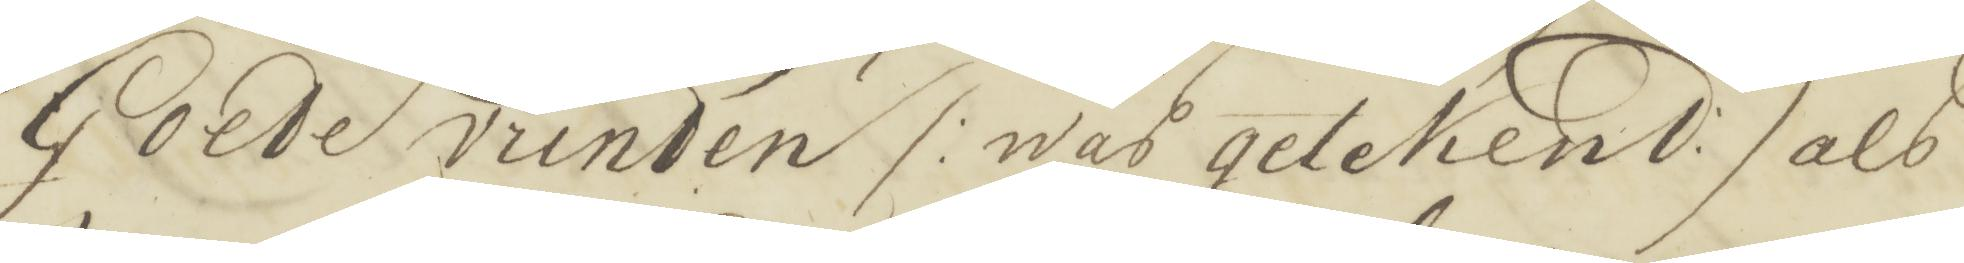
Goede vrinden /:was getekend:) als
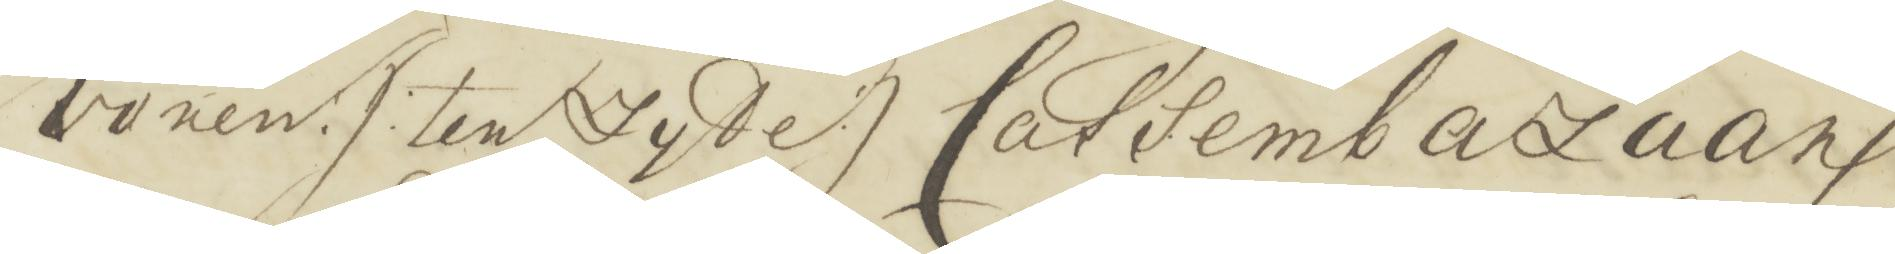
voren. /: ter Zyde :) Cassembazaar
